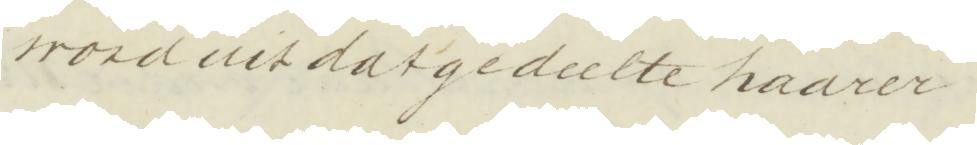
word uit dat gedeelte haarer
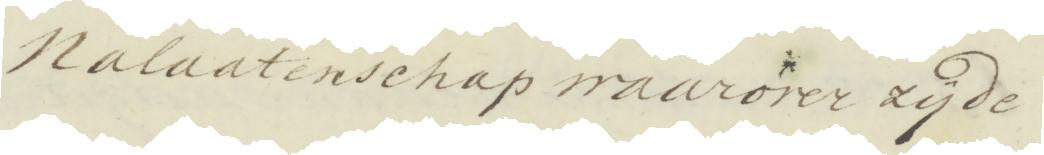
Nalaatenschap waarover zij de
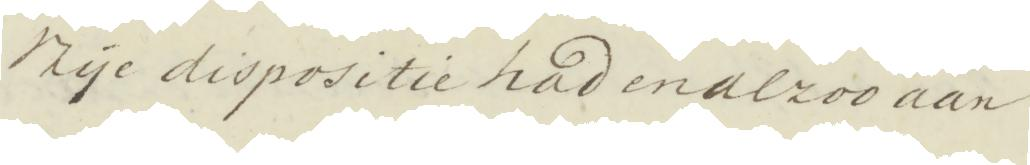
Vrije dispositie had en alzoo aan
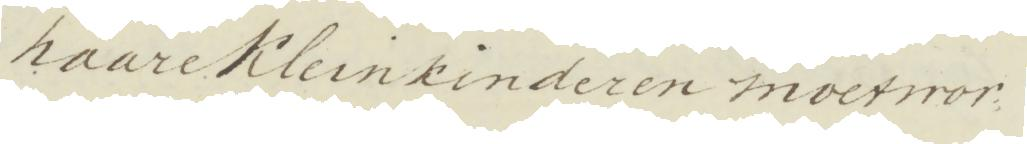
haare Kleinkinderen moet wor„
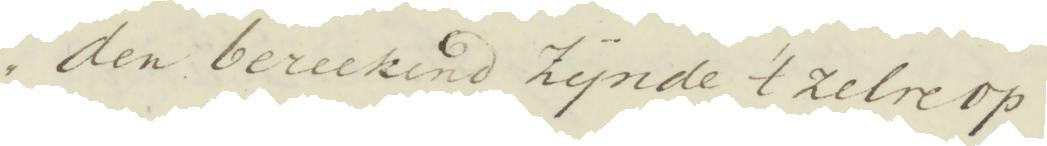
„den bereekend Zijnde ’t zelve op
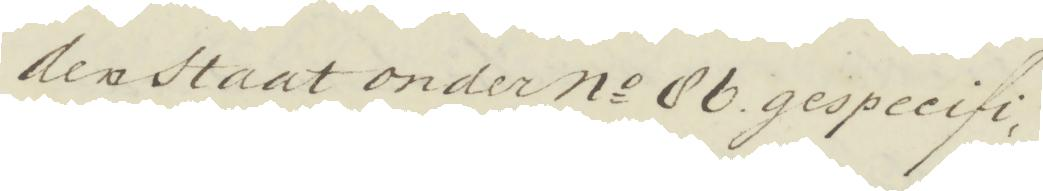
den staat onder N=o 86. gespecifi„
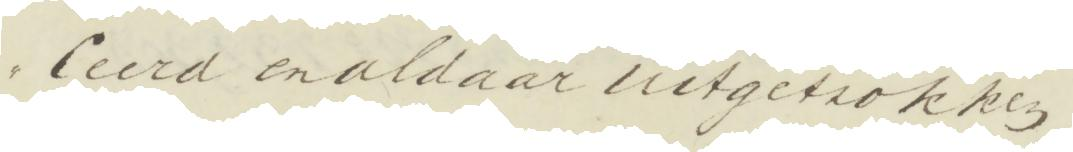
„ceerd en aldaar uitgetrokken
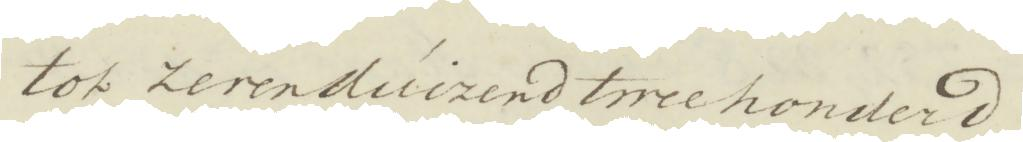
tot zevenduizend twee honderd
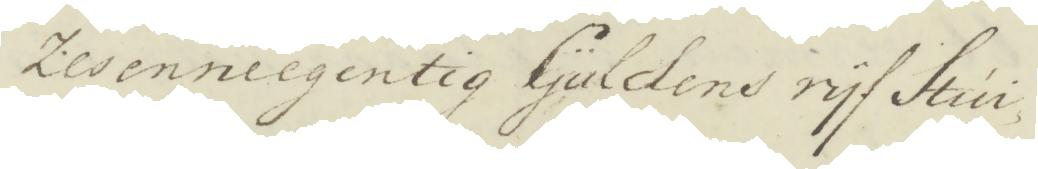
zes en neegentig Guldens vijf stui,
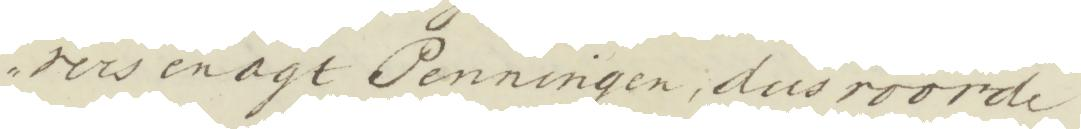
„vers en agt Penningen; dus voor de
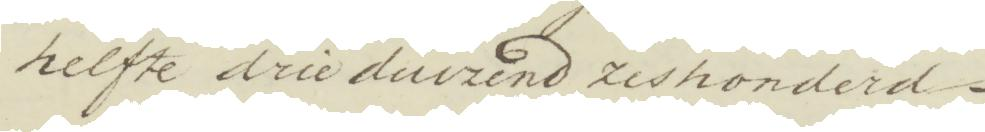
helfte drie duizend zeshonderd
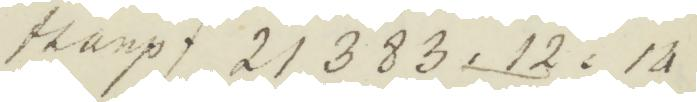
tranp ƒ 21383 : 12 : 14
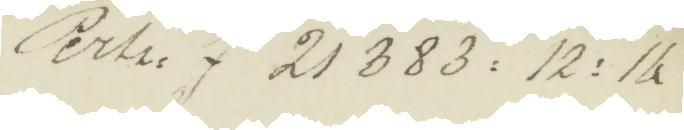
Pertr: ƒ 21383 : 12 : 14
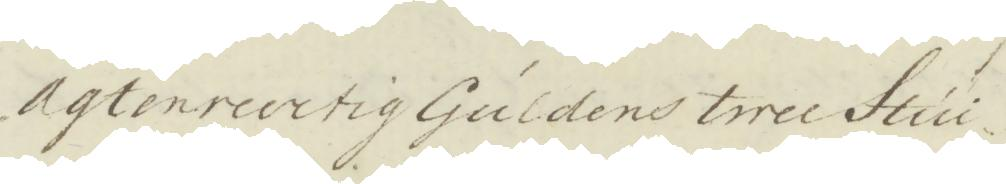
agtenveertig Guldens twee Stui„
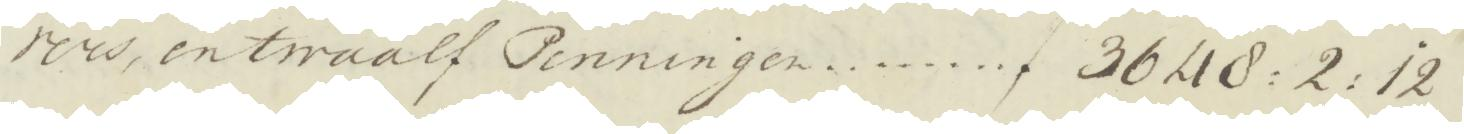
vers, en twaalf Penningen. . . . . . . . ƒ 3648 : 2 : 12
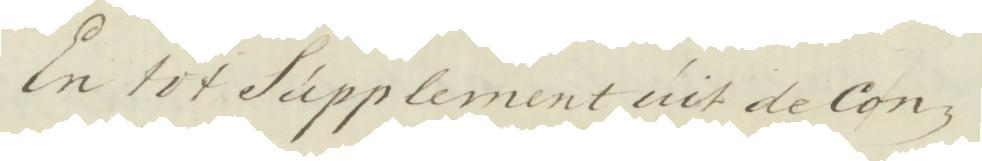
En tot supplement uit de con„
